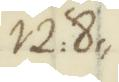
12:8„
